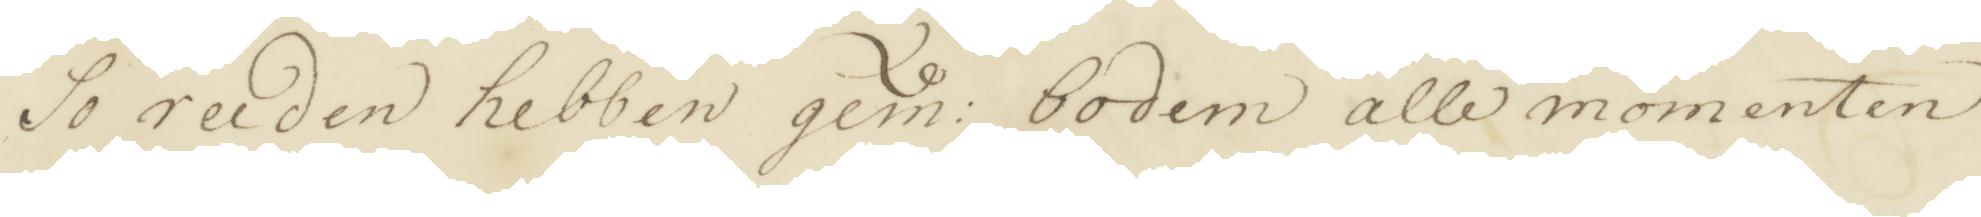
so reeden hebben gem: bodem alle momenten
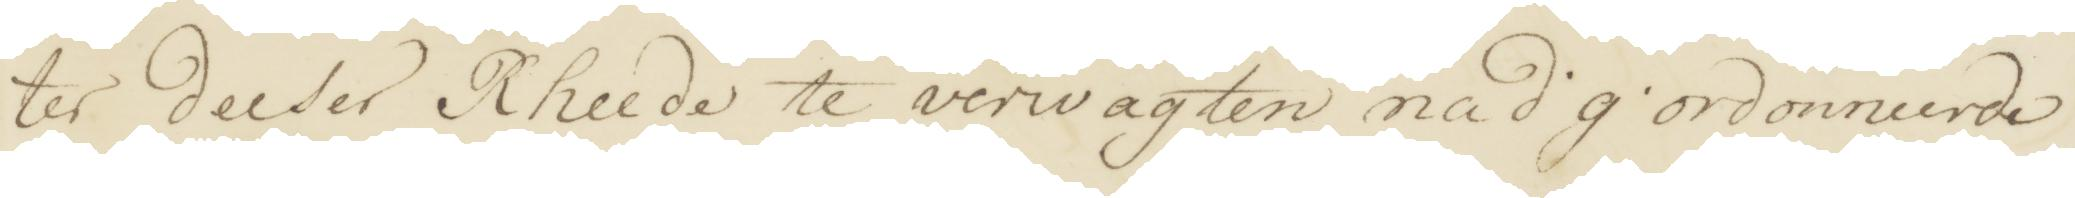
ter deeser Rheede te verwagten na d’g’ordonneerde
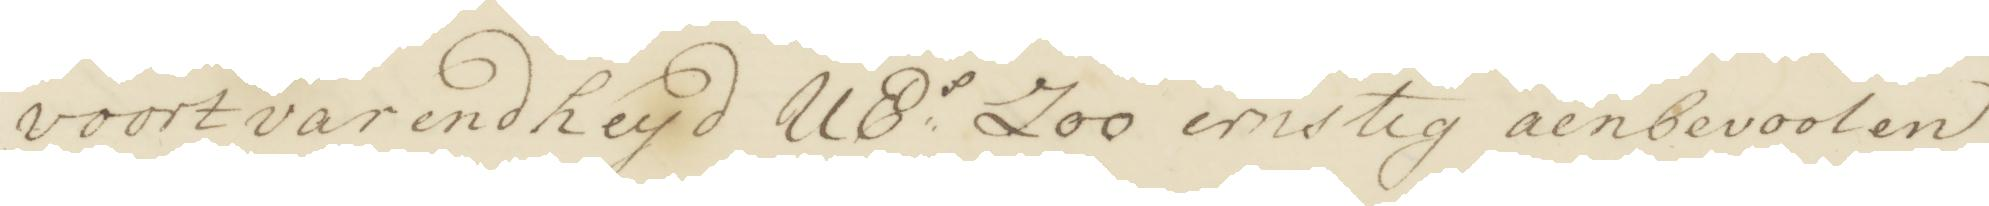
voortvarendheyd UE:s zoo ernstig aenbevoolen
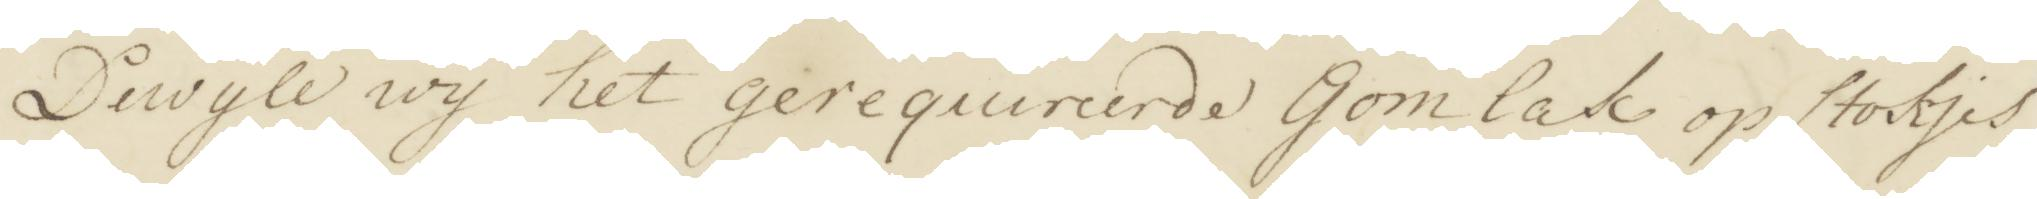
Dewyle wy het gerequireerde Gom lak op stokjes
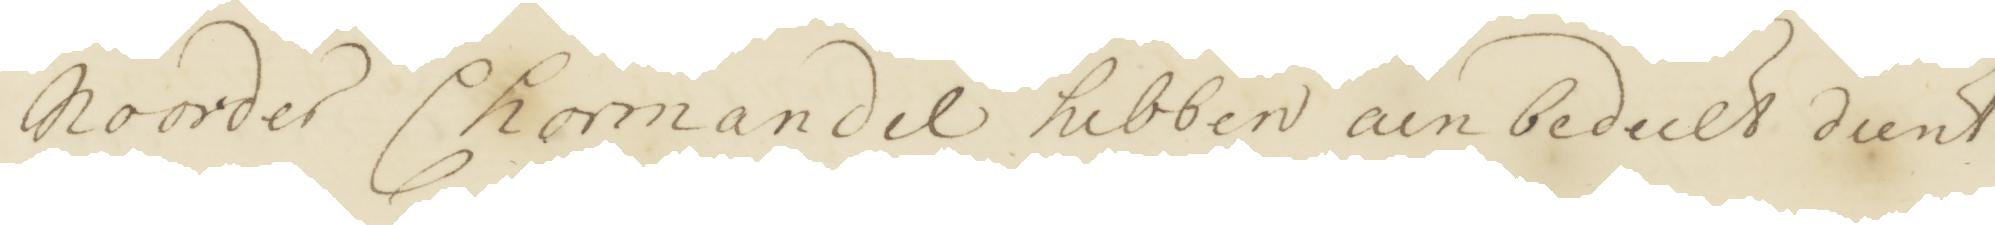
Noorder Chormandel hebben aen bedeelt dient
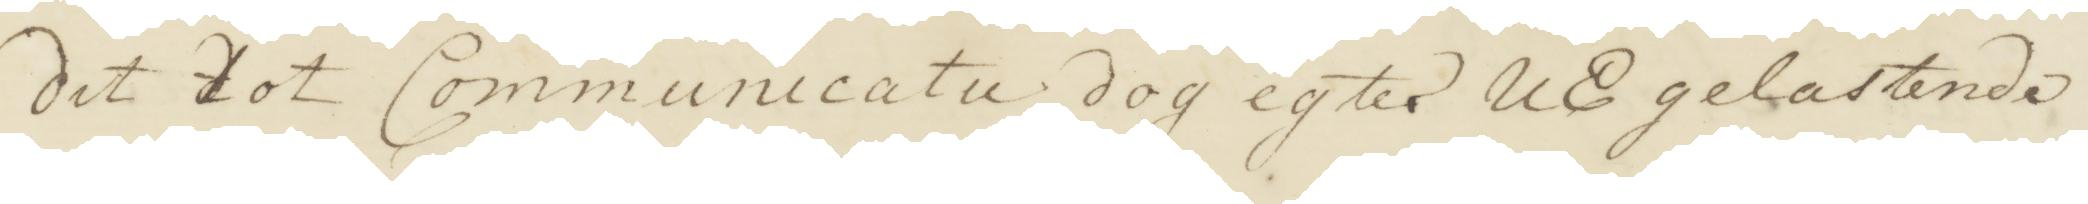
dit tot Communicatie dog egter UE gelastende
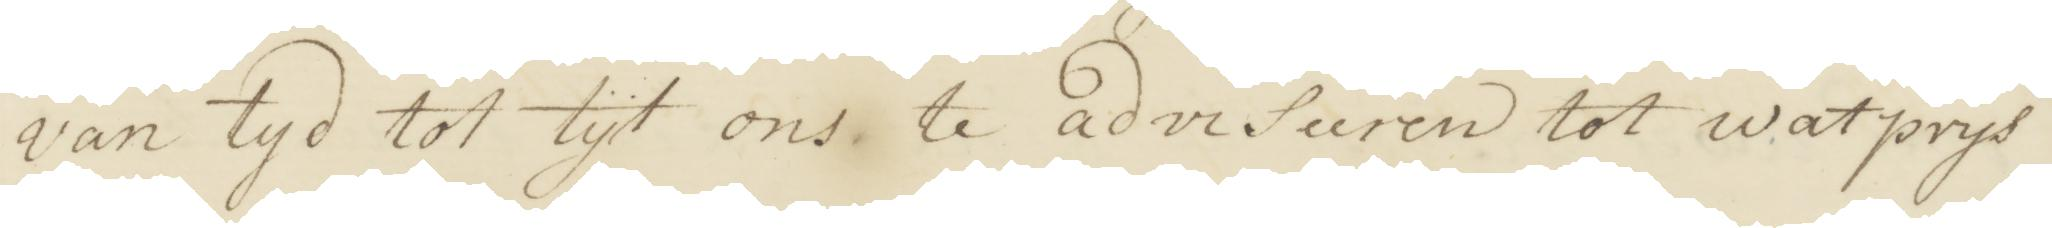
van tyd tot tijt ons te adviseeren tot wat prys
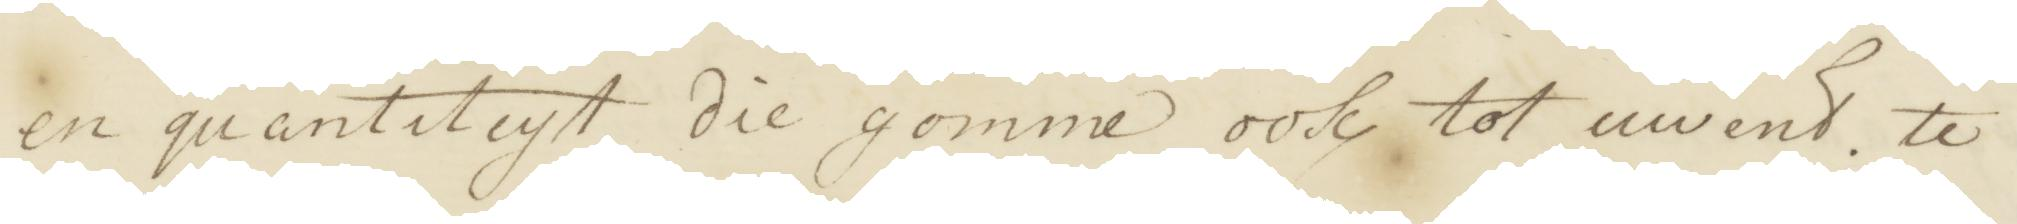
en quantiteyt die gomme ook tot uwent te
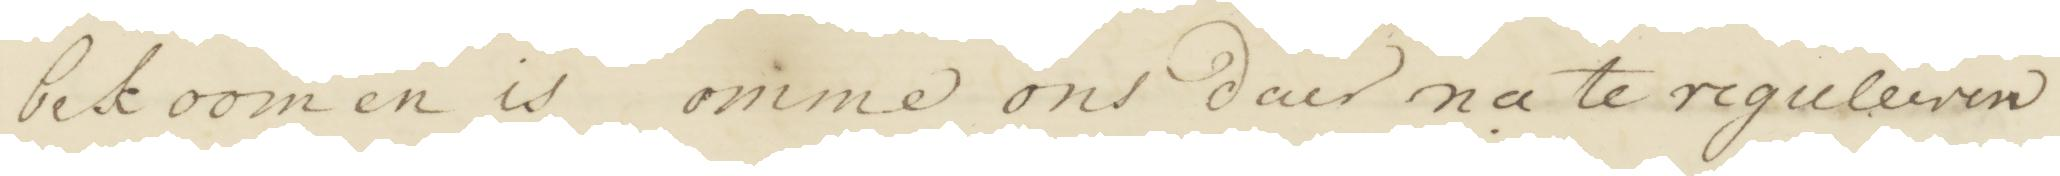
bekoomen is omme ons daer na te reguleeren
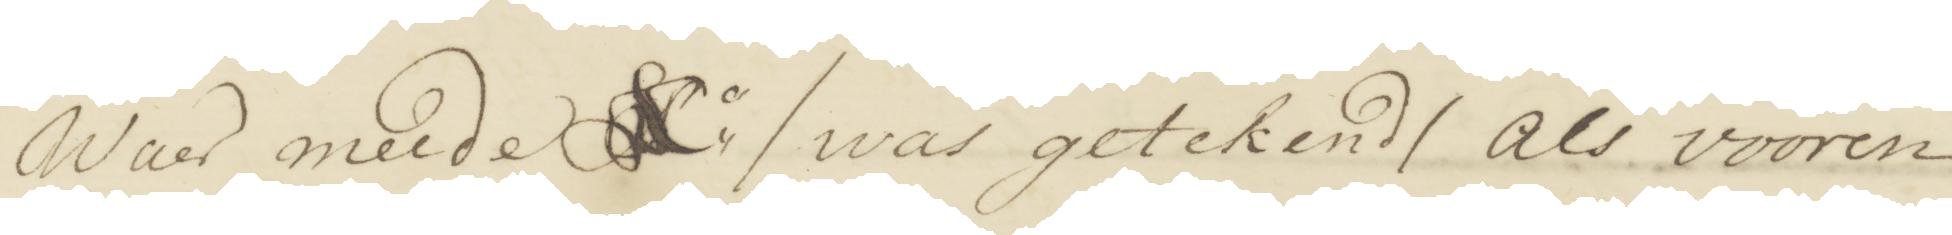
waer meede &„a / was getekend/ als vooren
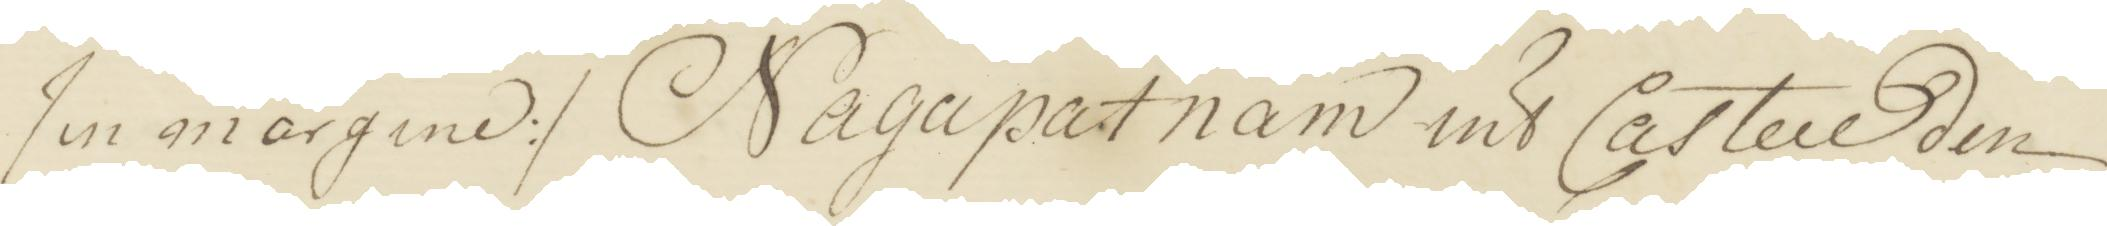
/in margine:/ Nagapatnam in’t Casteel den
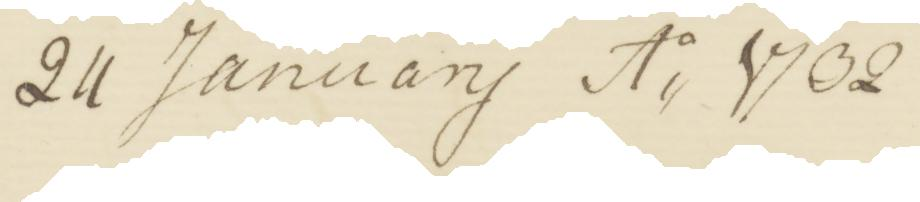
24 January A„o 1732
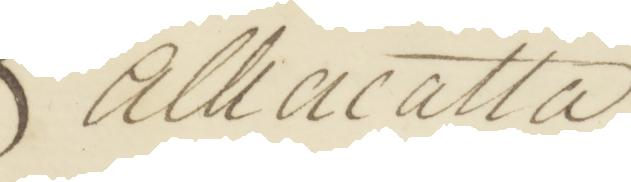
Pallacatta.
